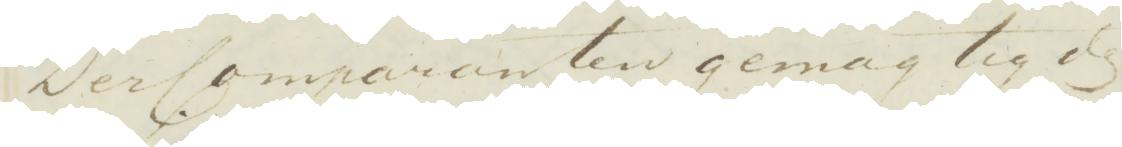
Der Comparanten gemagtigde
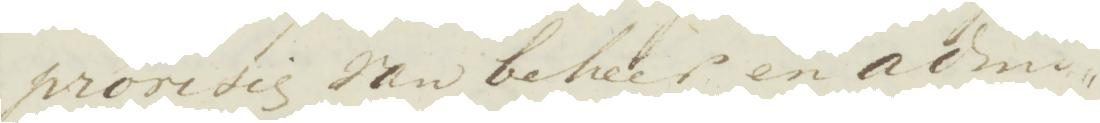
provisie van beheer en admi„
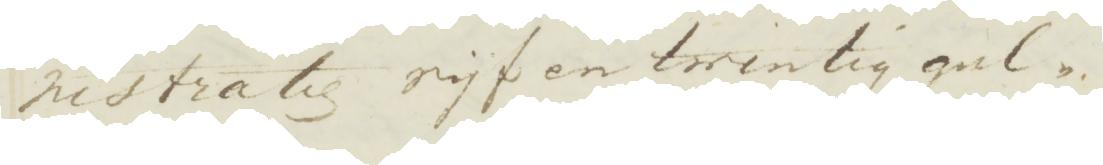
nistratie vijf en twintig gul„
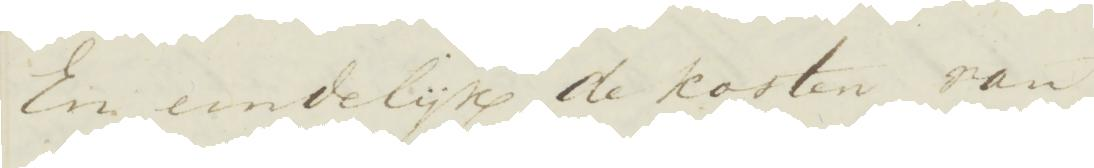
En eindelijk de kosten van
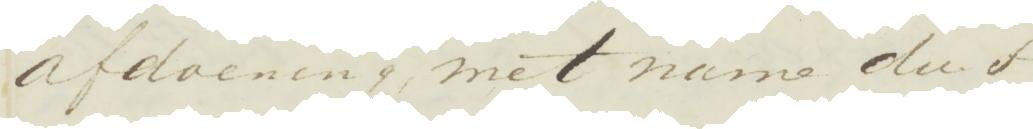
afdoening, met name dus
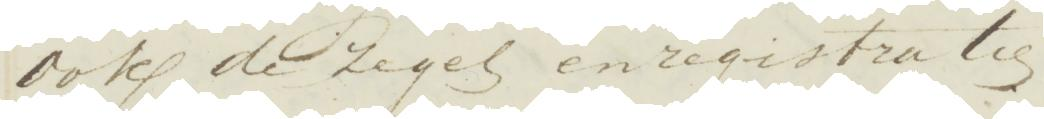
Ook de zegel en registratie
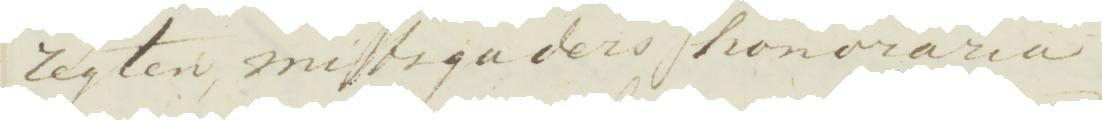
regten, mitsgaders honoraria
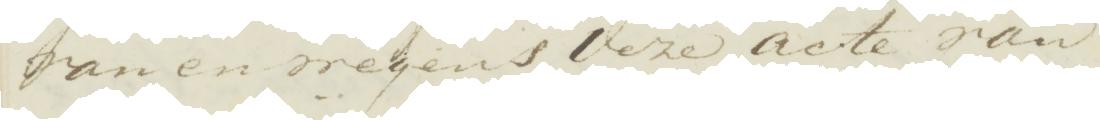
van en wegens deze acte van
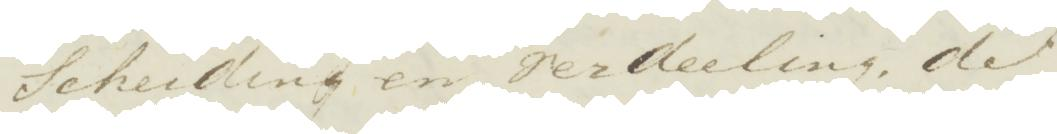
scheiding en verdeeling, de
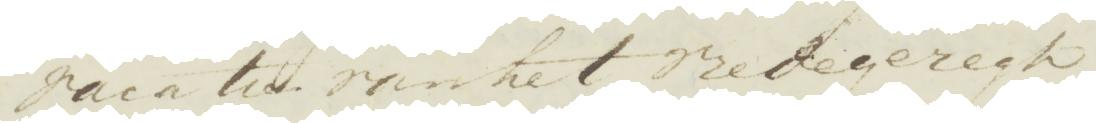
vacatie van het vredegeregt
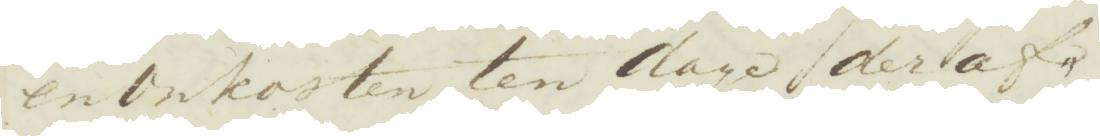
en Onkosten ten dage der af„
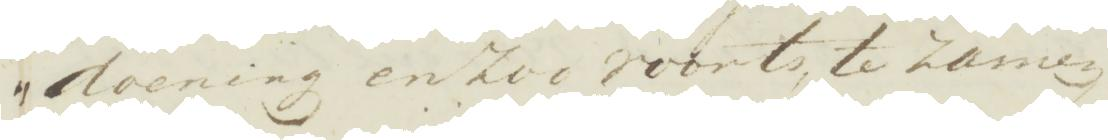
„doening en zoo voorts, te zamen
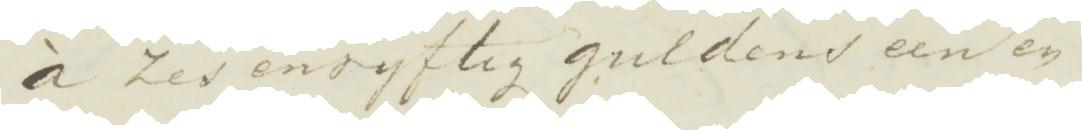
à zes en vijftig guldens een en
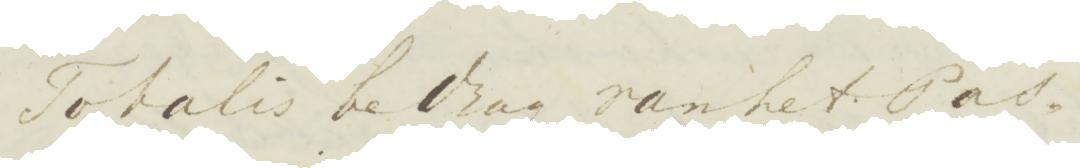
Totalis bedrag van het Pas„
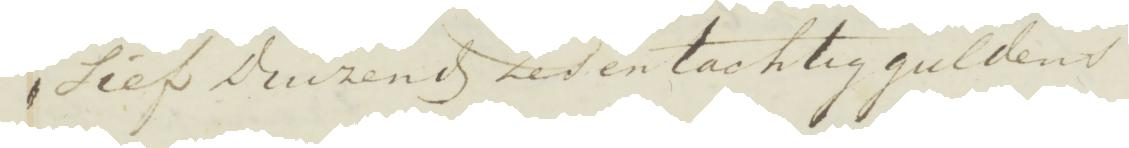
„sief Duizend Zes en tachtig guldens
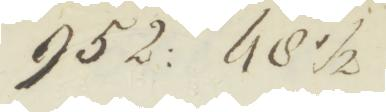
952: 48½
